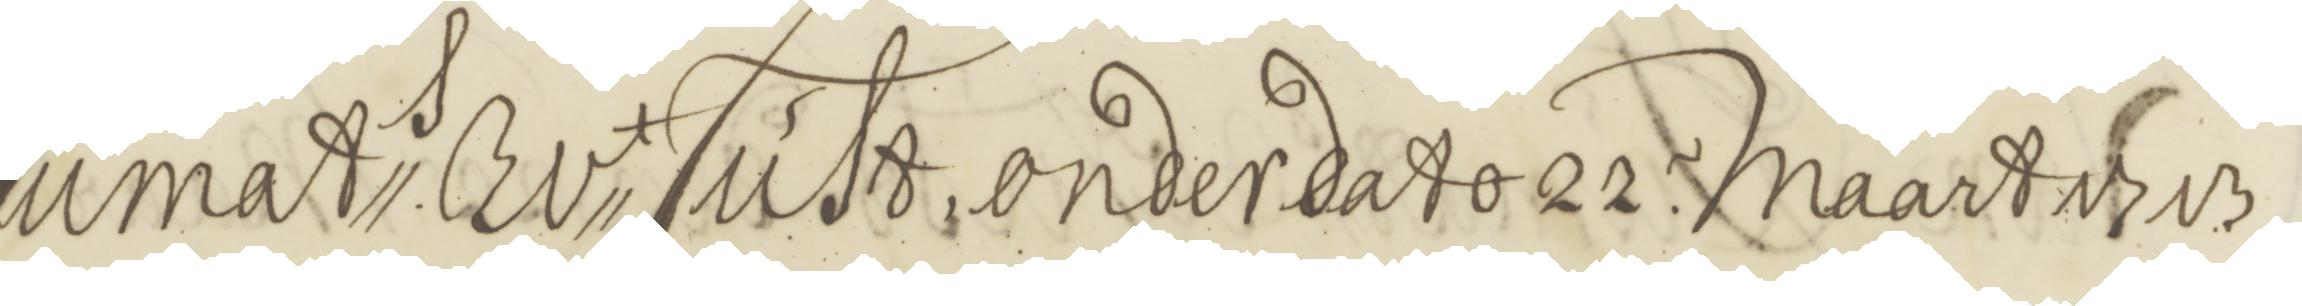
Van Sumat„s W„t Cust, onder dato 22.' maart 1713.
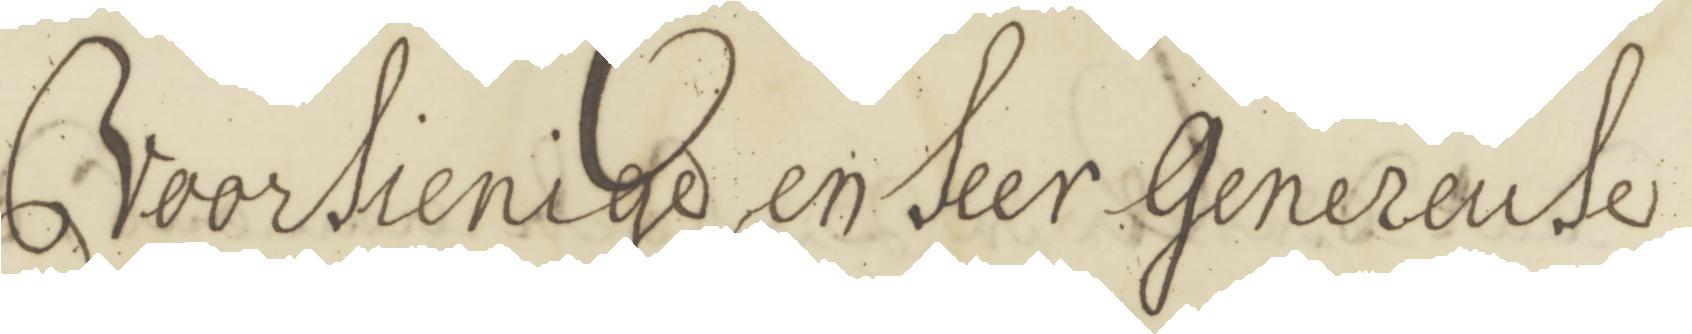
Voorsienige en seer Genereuse
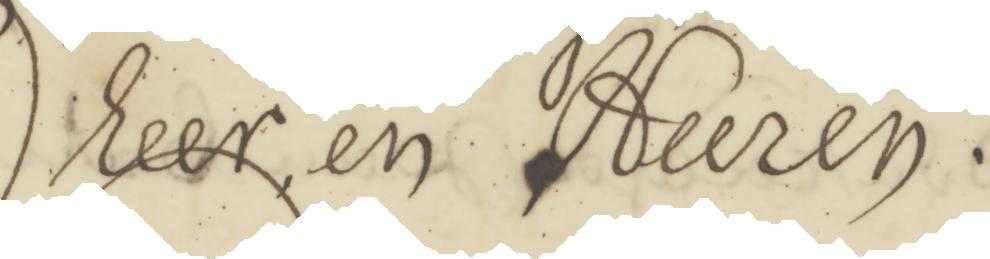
heer, en Heeren.
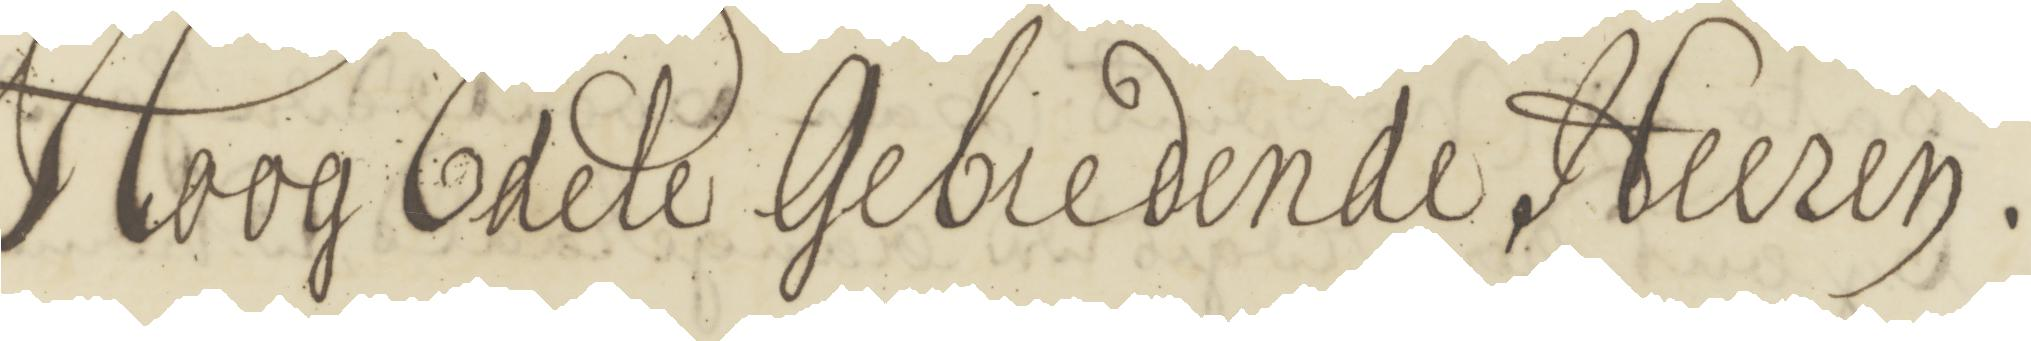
Hoog Edele Gebiedende Heeren.
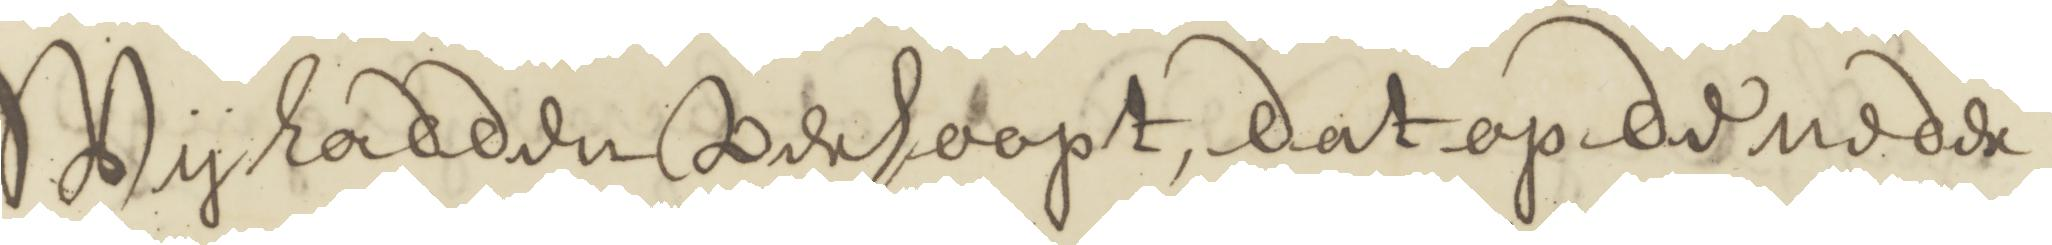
Wij hadden verhoopt, dat op de neder
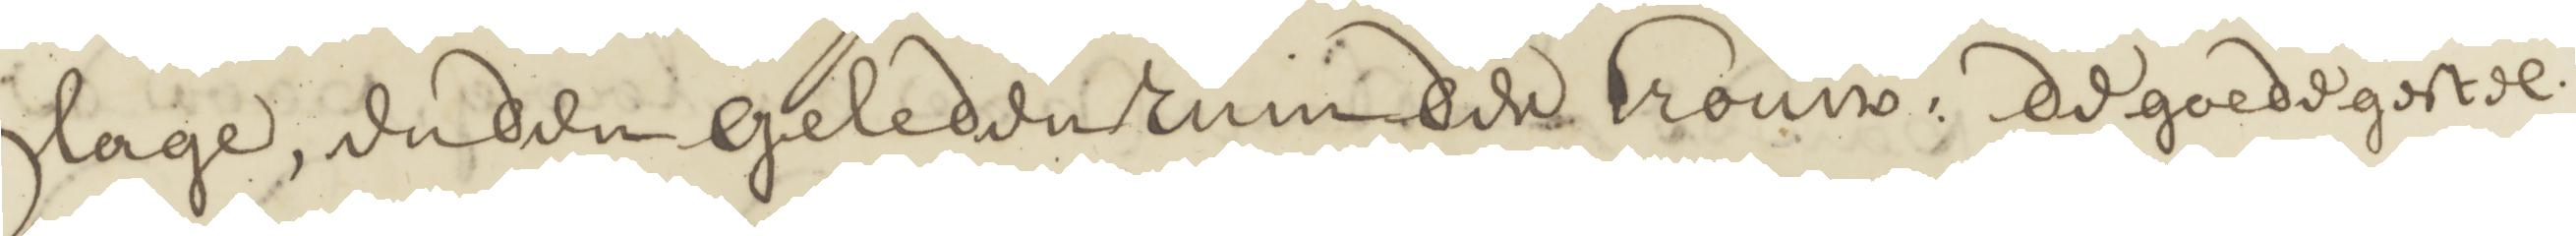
lage, en den geleden ruin der trouw„ de goede gestel.
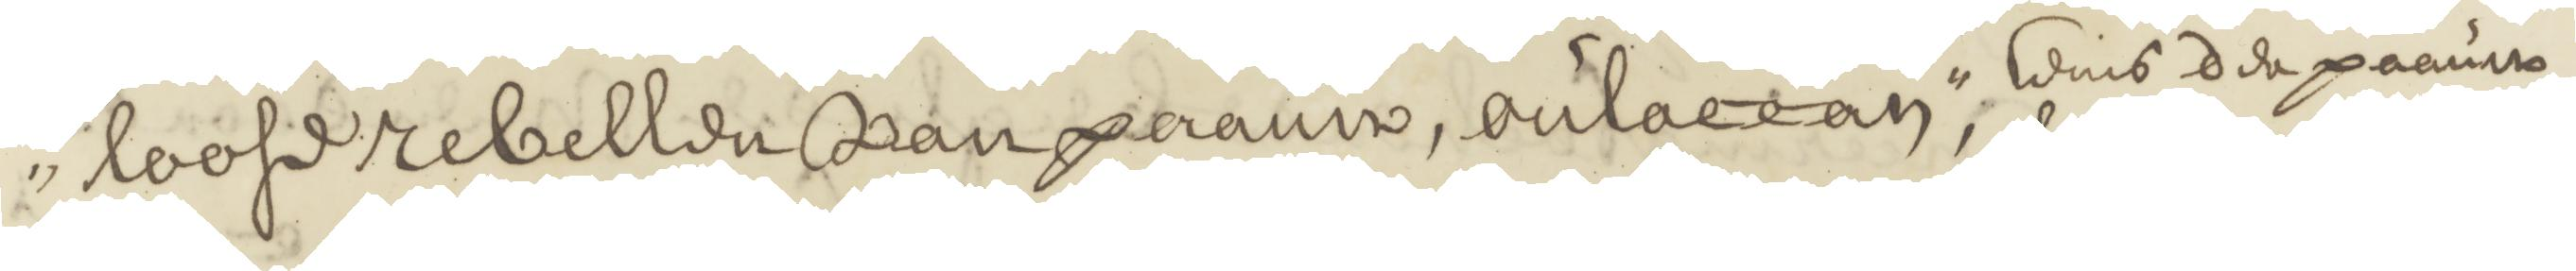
„loose rebellen dan prauw, oulaccan, „tenis der prauw
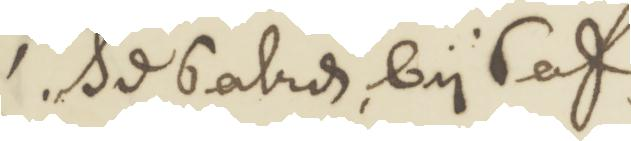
se saken, bij ’t af
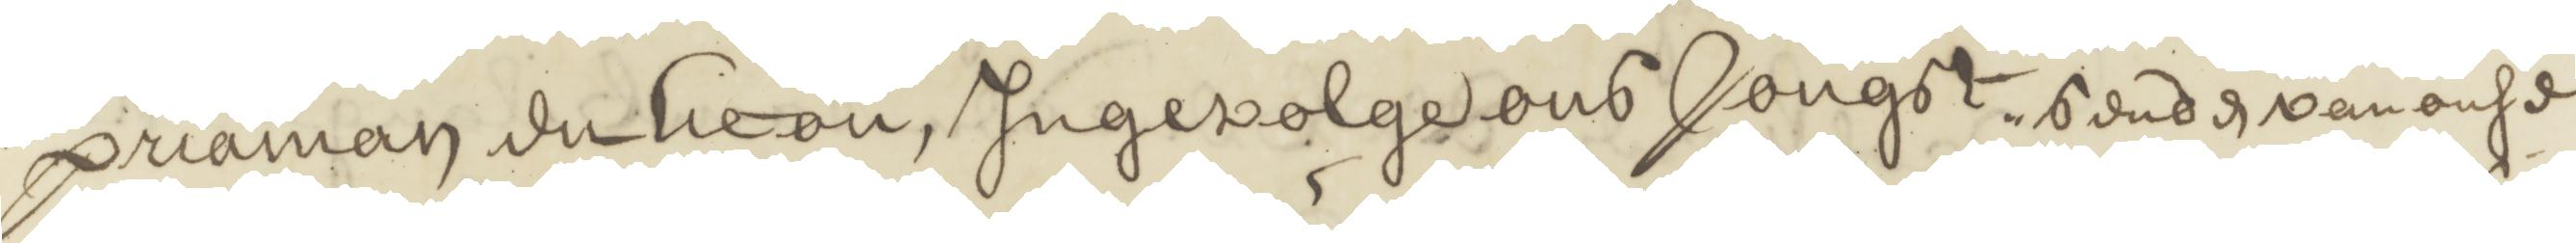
priaman en ticon, Jngevolge ons jongst „senden van onse
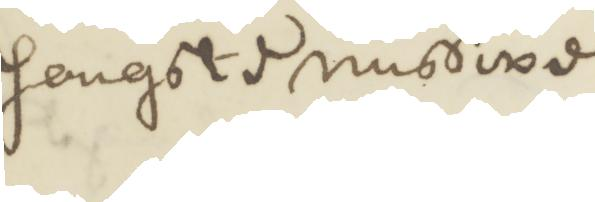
Jongste missive
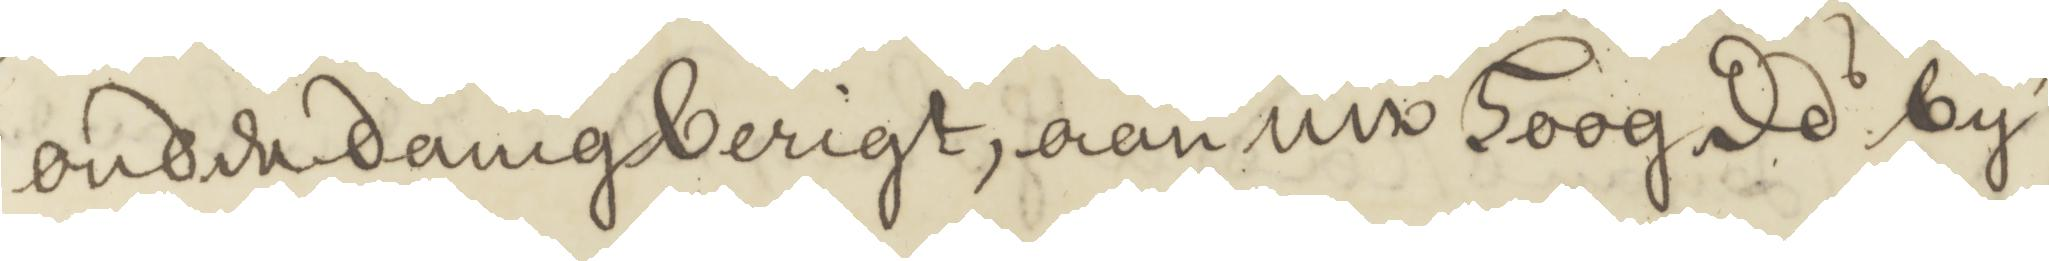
onderdanig berigt, aan uw hoog Ed,s bij
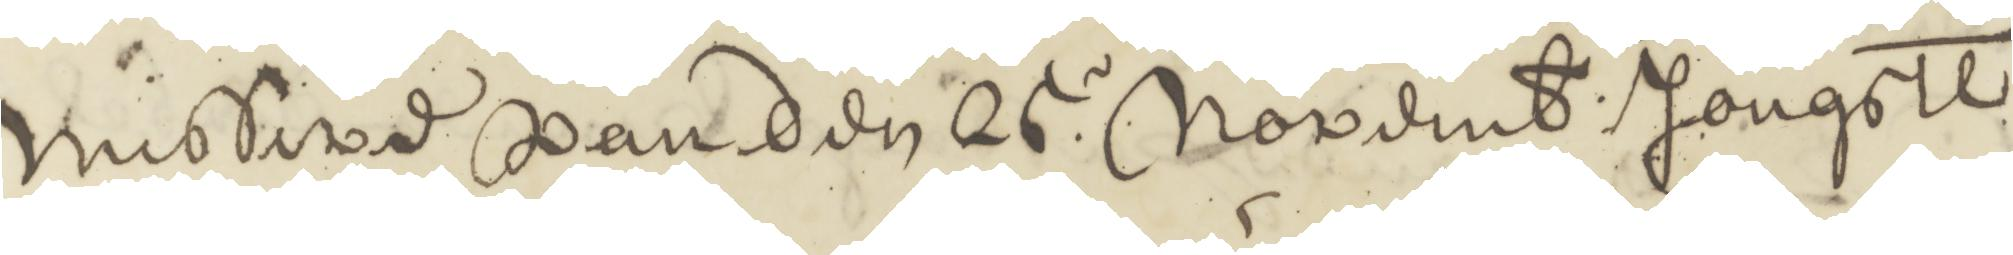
missive van den 25.' Novemb. Jongste
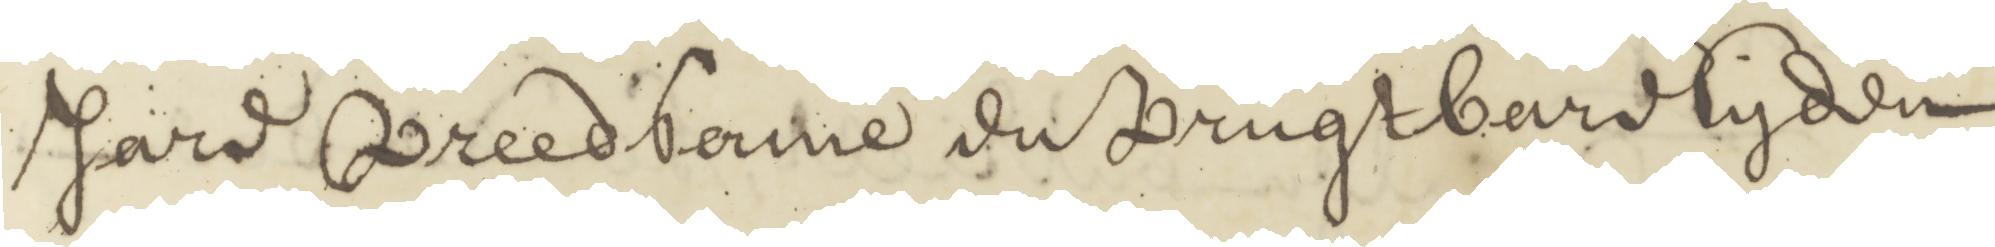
Jare vreedsame en vrugtbare tijden
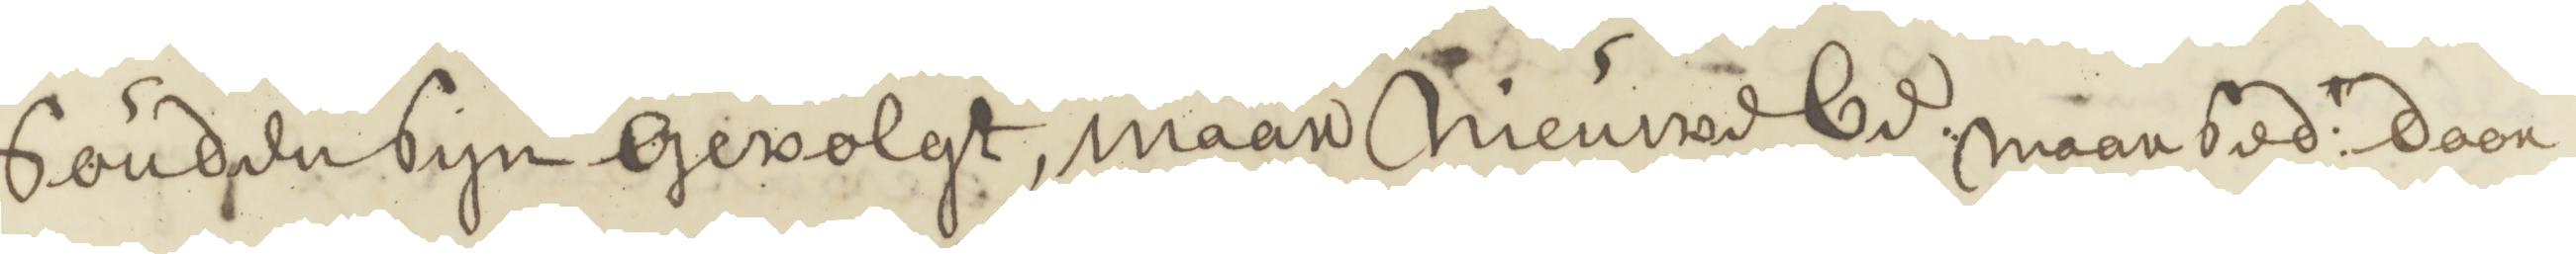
souden sijn gevolgt, maar nieuwe be„ maar sed: door
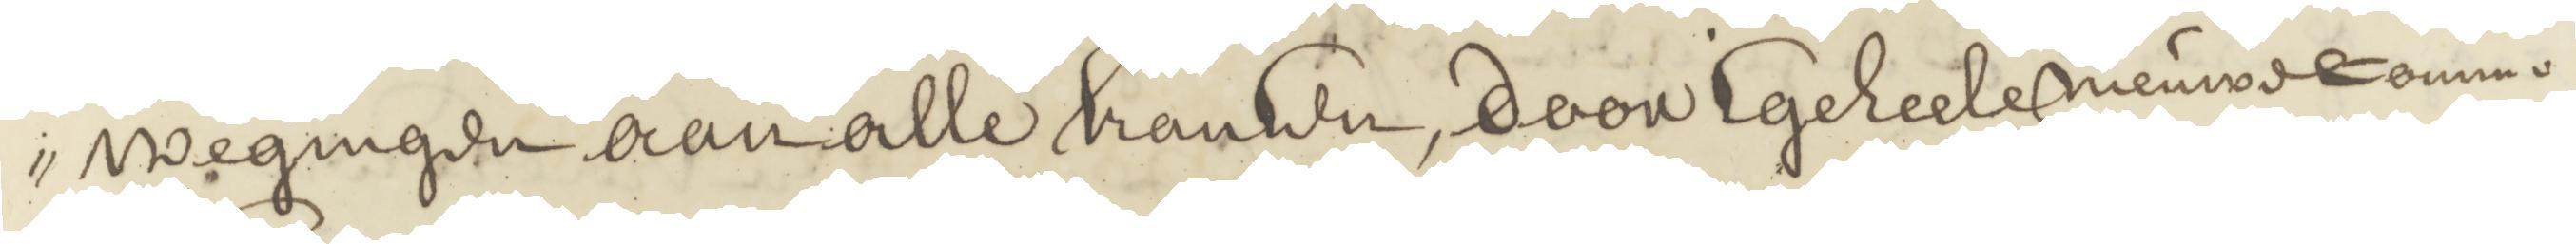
„wegingen aan alle kanten, door 't geheele nieuwe comme
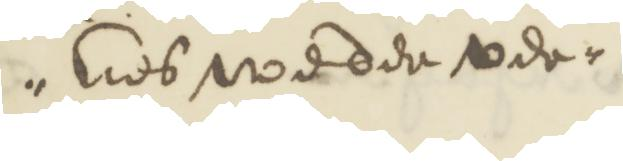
„ties weder ver„
